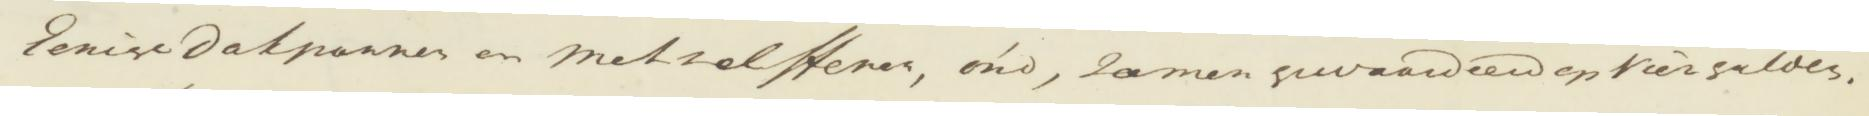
Eenige dakpannen en metzelstenen, oud, zamen gewaardeerd op vier gulden.
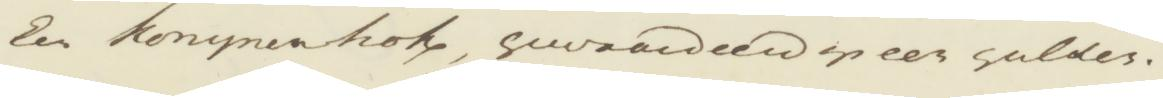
Een konynenhok, gewaardeerd op een gulden.
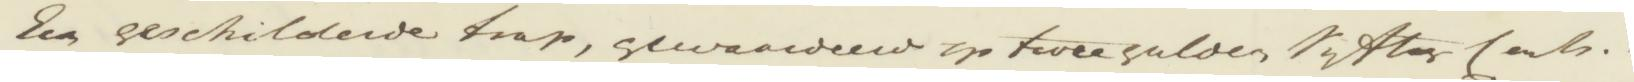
Een geschilderde trap, gewaardeerd op twee gulden Vyftig Cents.
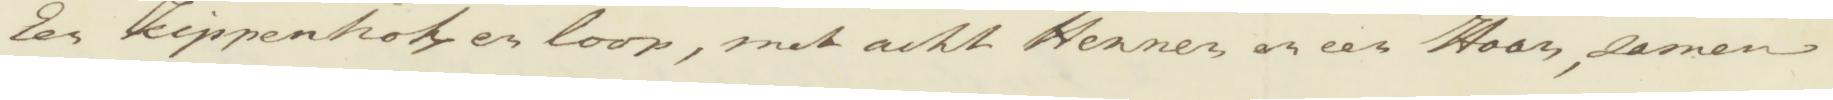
Een kippenhok en loop, met acht Hennen en een Haan, zamen
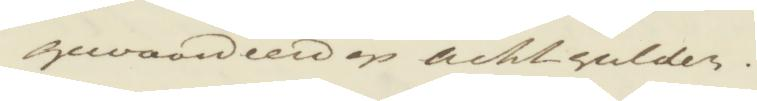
gewaardeerd op acht gulden.
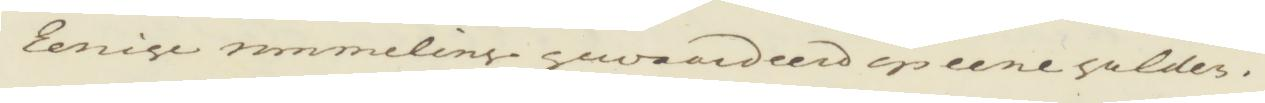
Eenige rommeling gewaardeerd op eene gulden.
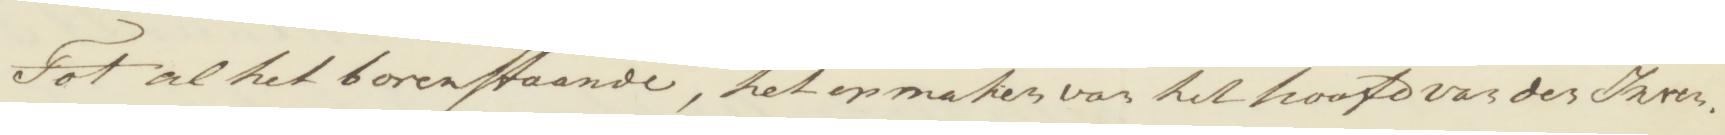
Tot al het bovenstaande, het opmaken van het hoofd van den Inven.
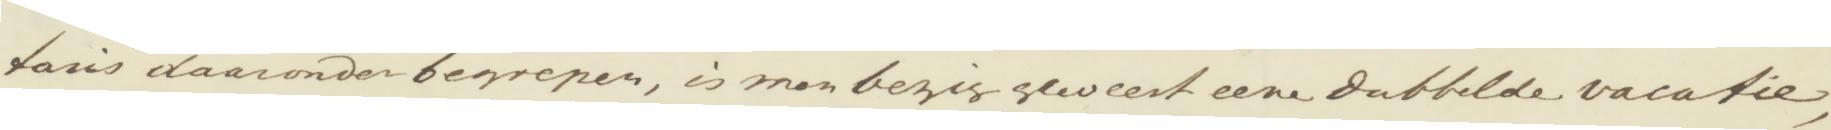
taris daaronder begrepen, is men bezig geweest eene dubbelde vacatie,
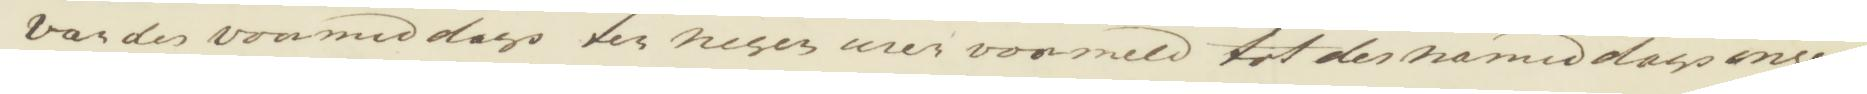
van des voormiddags ten negen uren voormeld tot des namiddags onge„
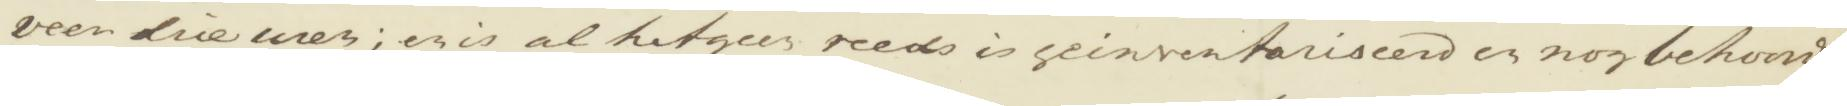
veer drie uren; en is al hetgeen reeds is geinventariseerd en nog behoord
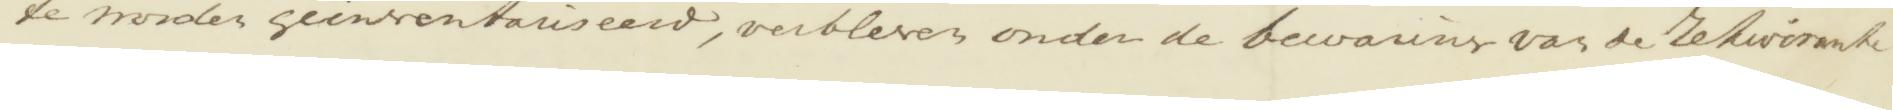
te worden geinventariseerd, verbleven onder de bewaring van de rekwirante
